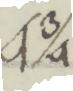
4¾
